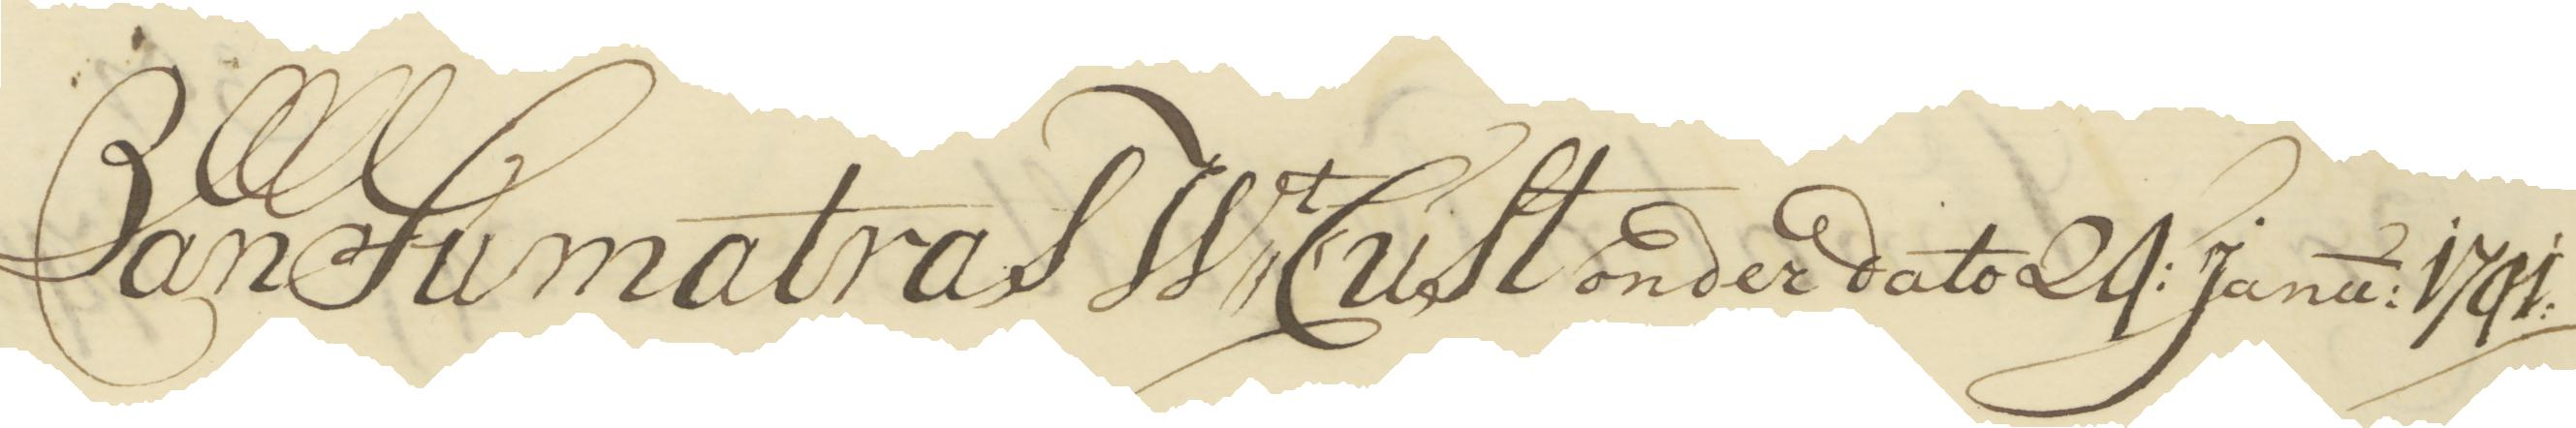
Van Sumatras W„t Cust onder dato 24:' Janu: 1741:
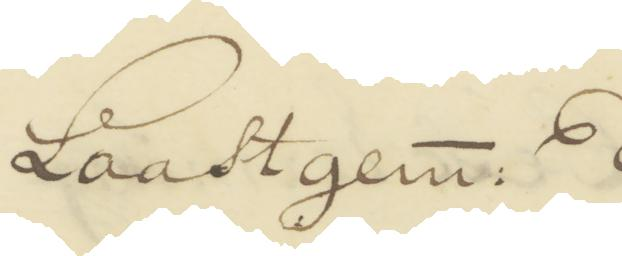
Laastgem:
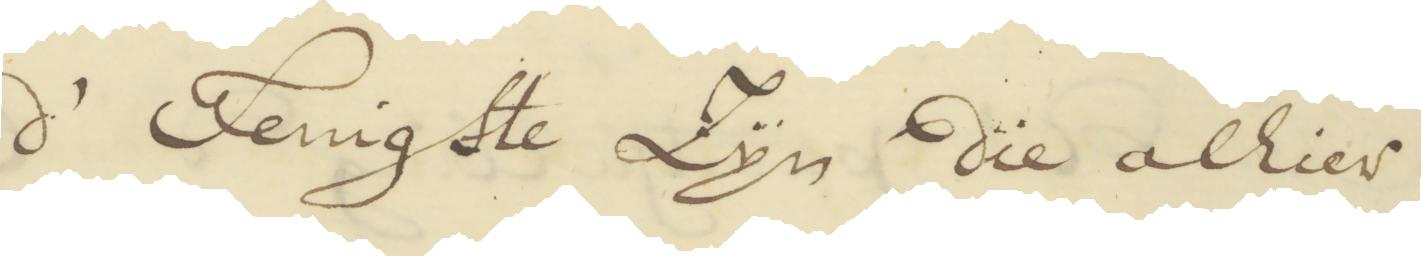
d’ Eenigste Zijn die alhier
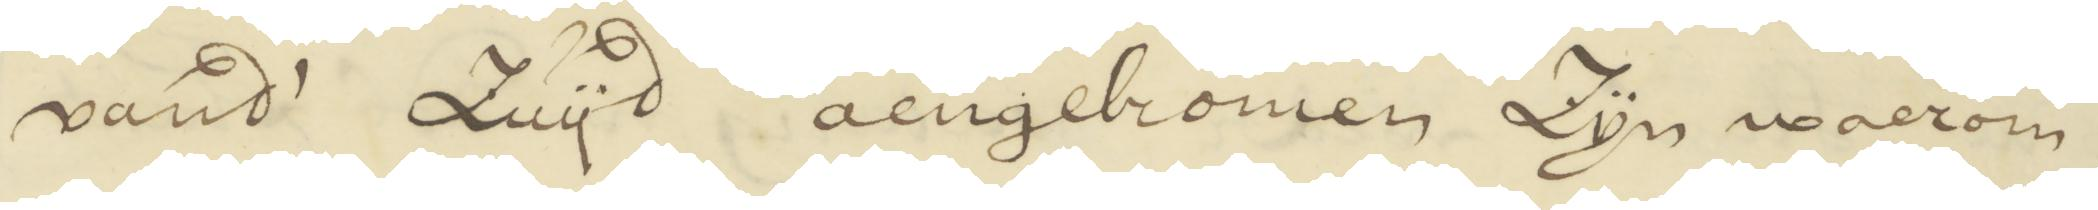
vand’ Zuijd aengekomen Zijn waerom
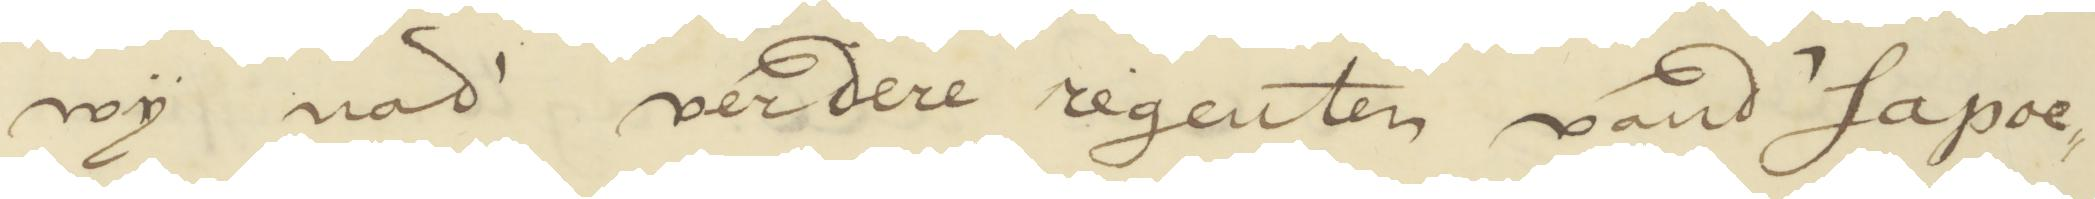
wij nad' verdere regenten vand’ Japoe„
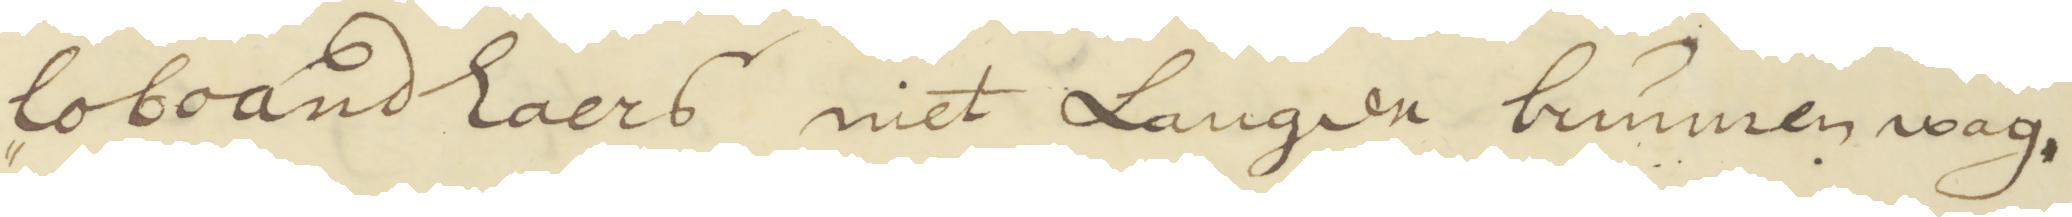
„loboandhaers niet langer kunnen wag„
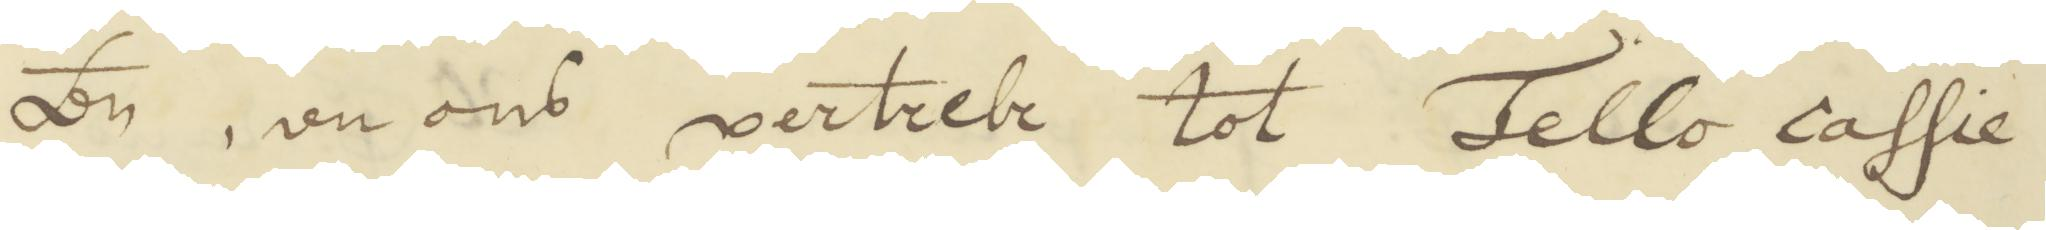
ten, en ons vertrek tot Tello cassie
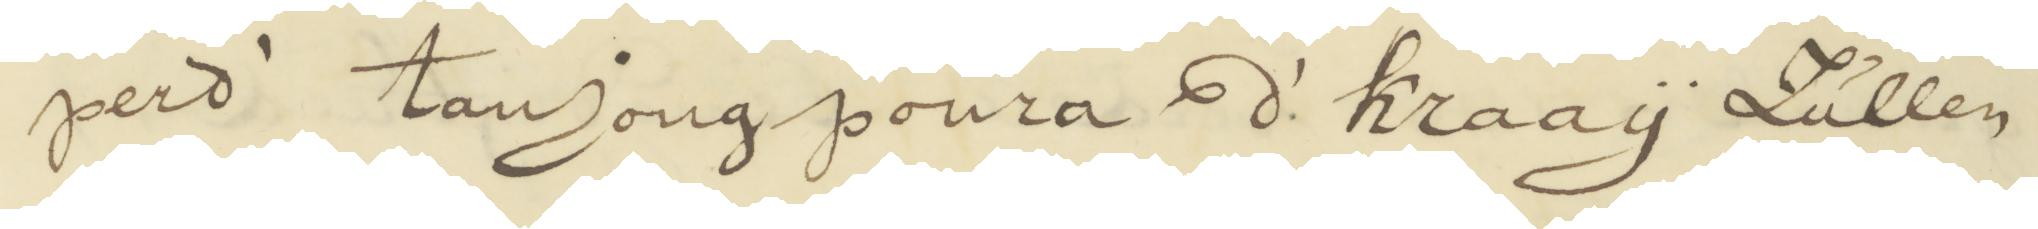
perd' tanjongpoura d: kraaij Zullen
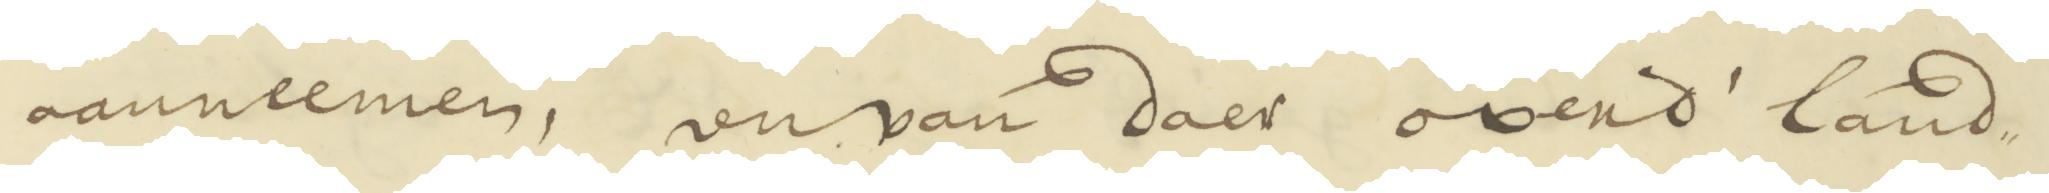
aanneemen, en van daer overd’ land„
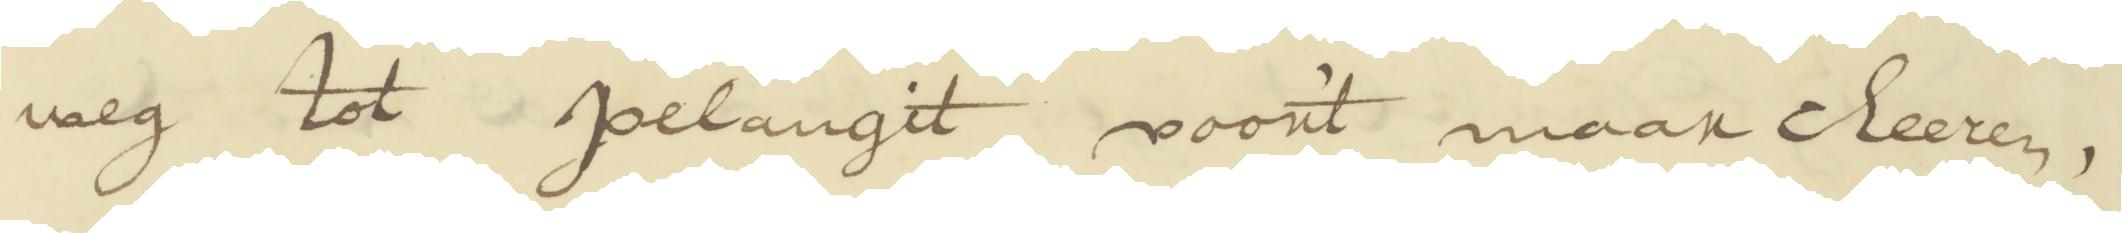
weg tot pelangit voor’t maarcheeren,
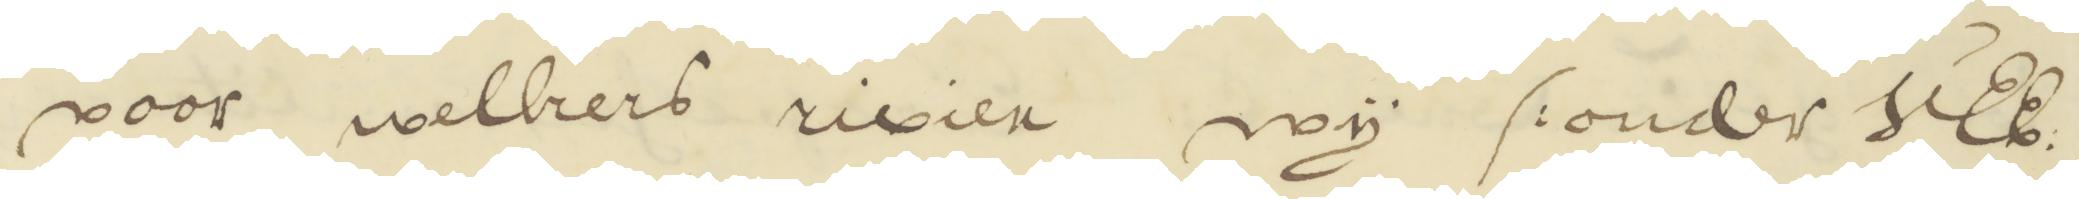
voor welkers rivier wij s:onder VEE:
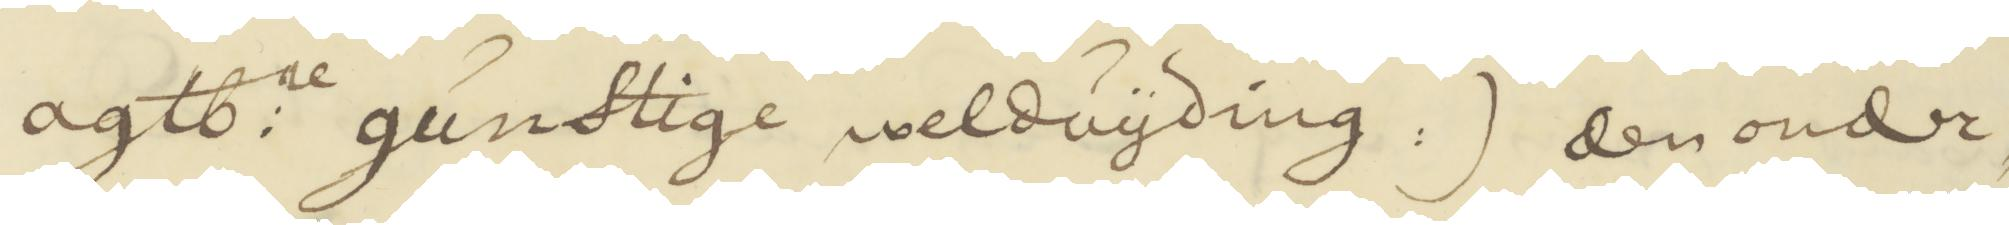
agtb:re gunstige welduijding:) den onder„
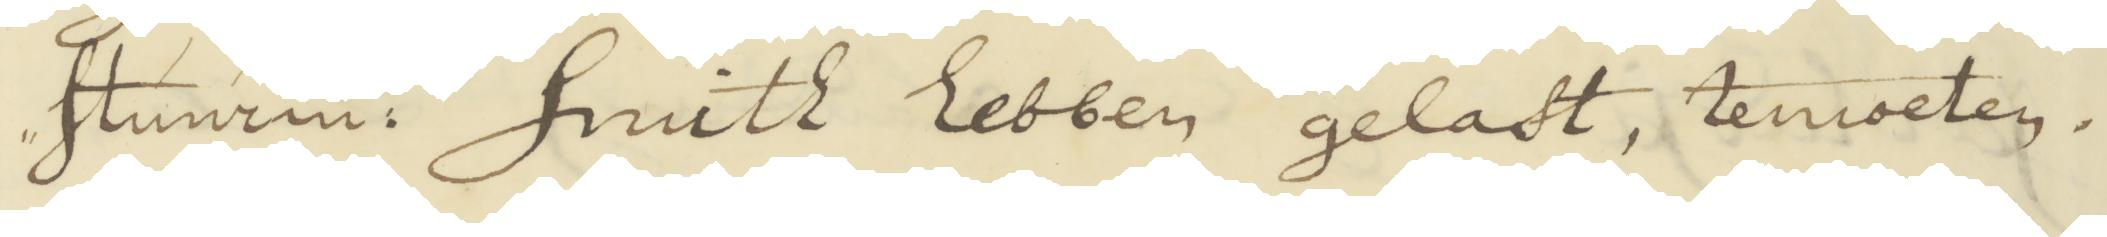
„stuurm: Smith hebben gelast, temoeten,
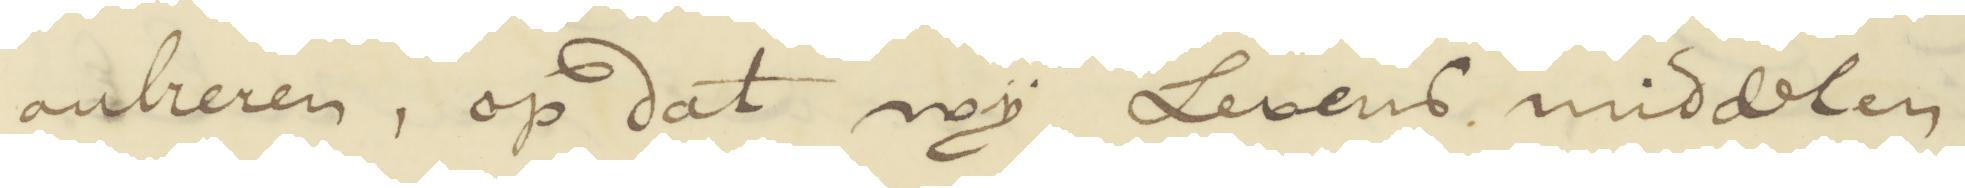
ankeren, op dat wij levens middelen
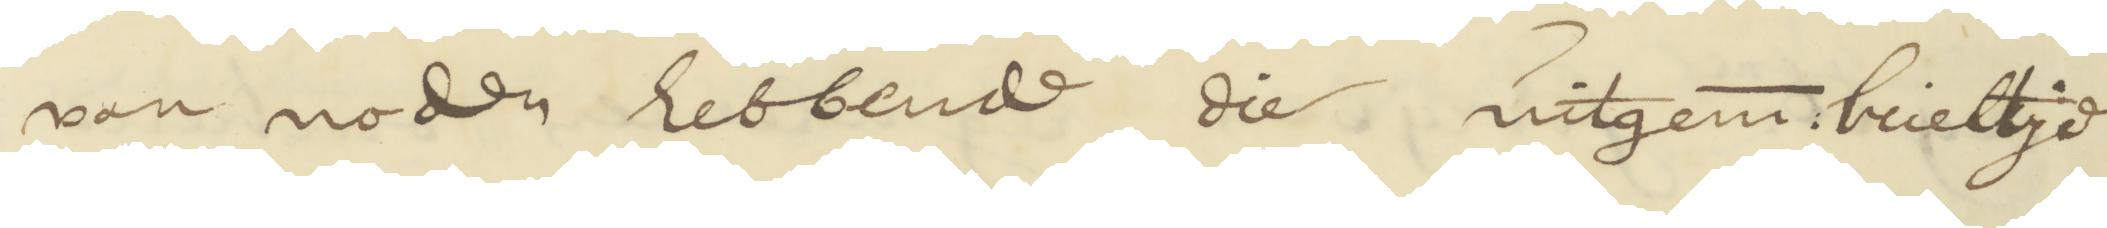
van noden hebbende die uitgem: kieltje
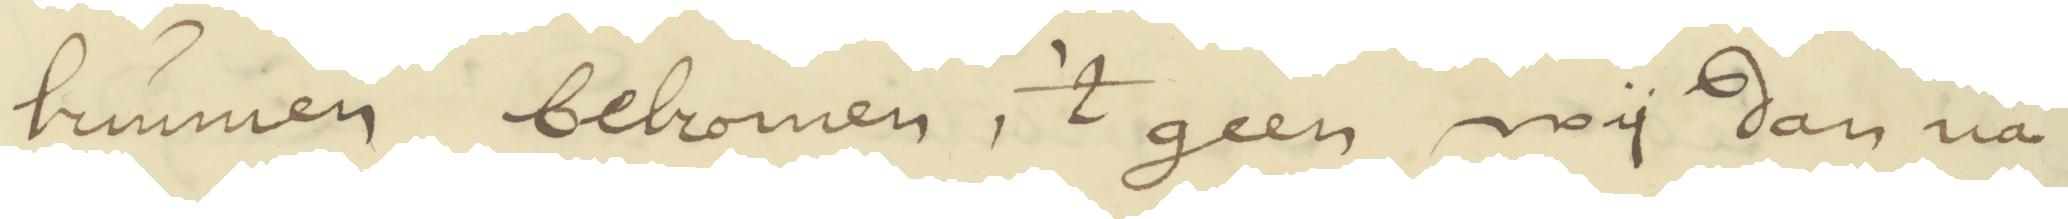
kunnen bekomen, ’t geen wij dan na
